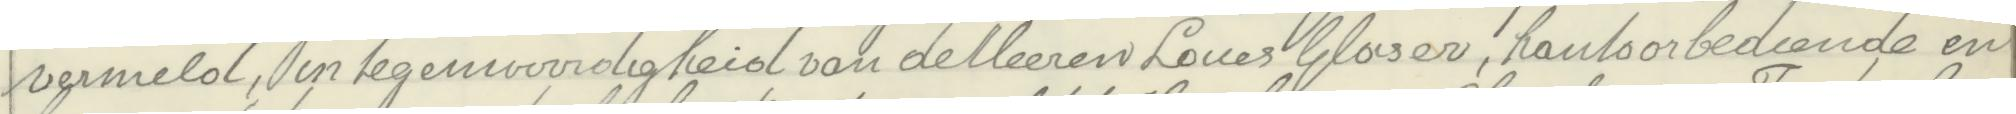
vermeld, in tegenwoordigheid van de Heeren Loues Glaser, kantoorbediende en
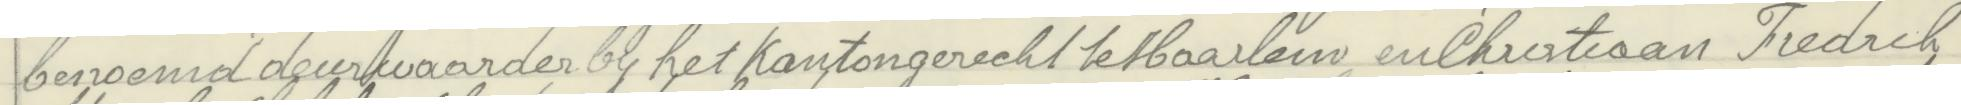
benoemd deurwaarder by het kantongerecht te Haarlem en Christiaan Fredrik
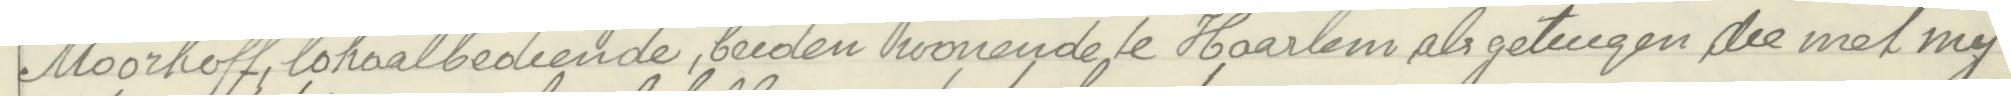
Moorhoff, lokaalbediende, beiden wonende te Haarlem als getuigen die met my
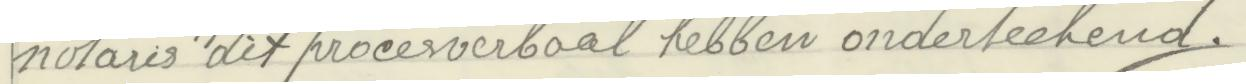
notaris dit procesverbaal hebben onderteekend.
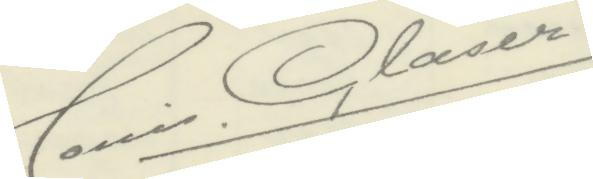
Louis. Glaser
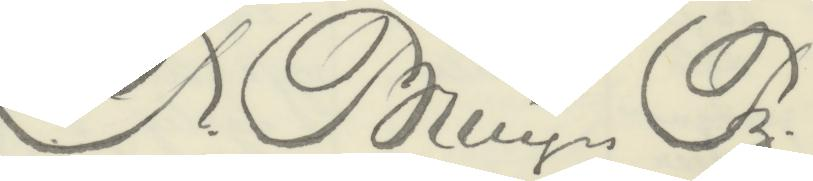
P. Bruijn Pz.
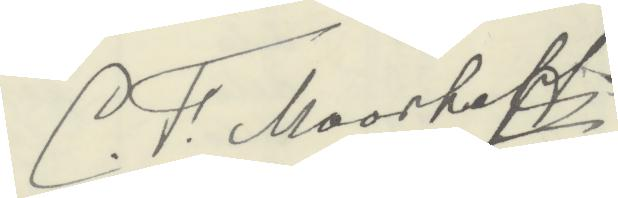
C.F. Moorhoff
